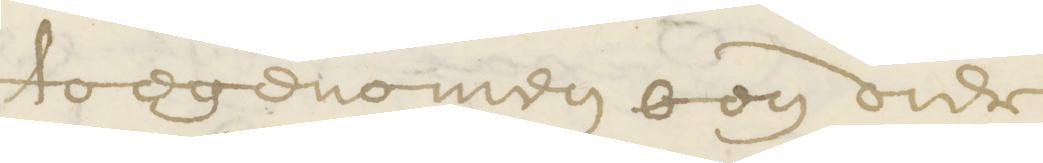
toegenomen ben dier
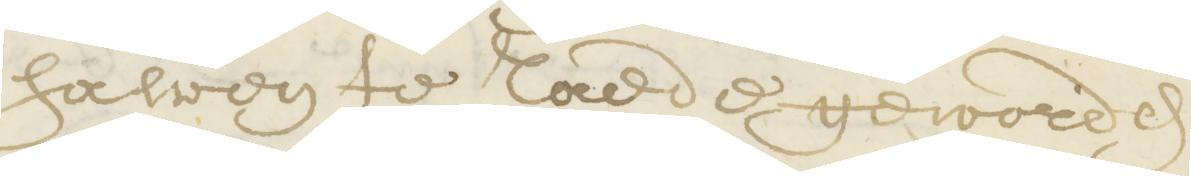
halven te raede geworden
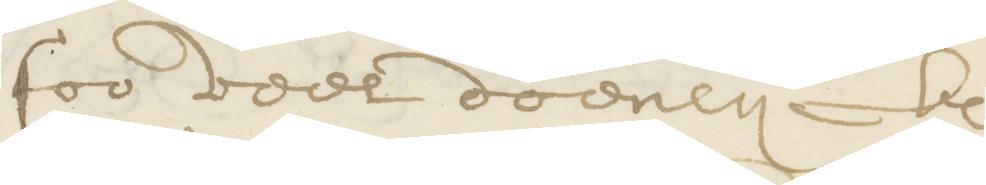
soo veel doenlijck
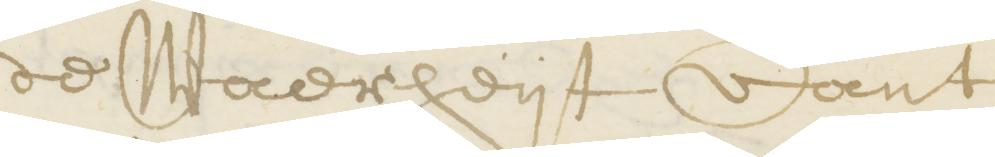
de Waerheijt vant
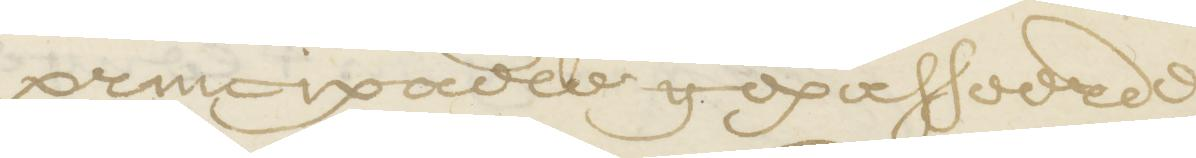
principaele gepasseerde
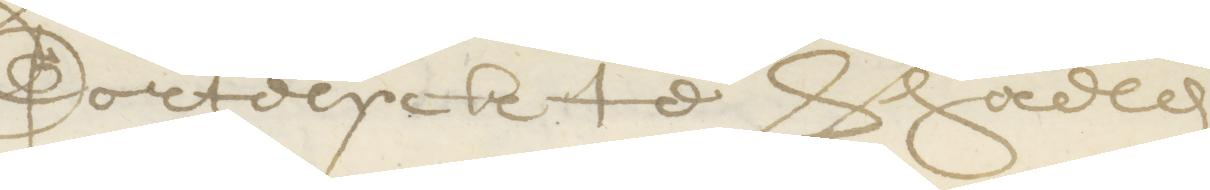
Cortelyck te verhaelen
